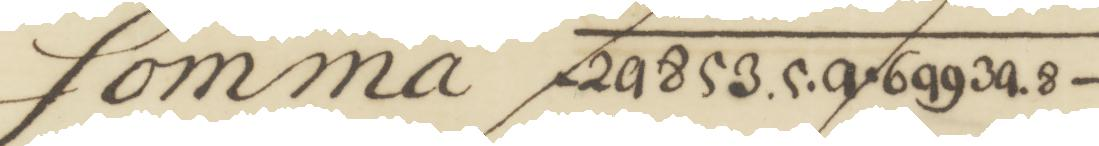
Somma ƒ24853.5:4ƒ64934.8—
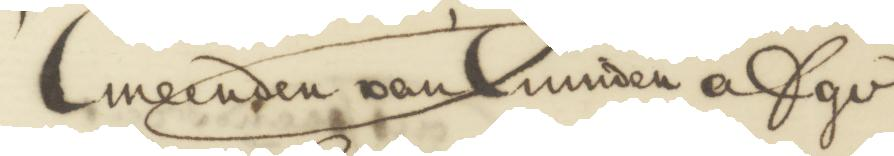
't meerder van 't minder afge
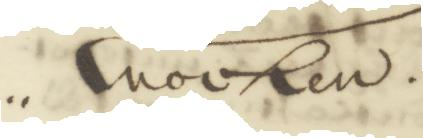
„trocken.
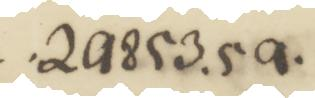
- - - 24853.5 4.
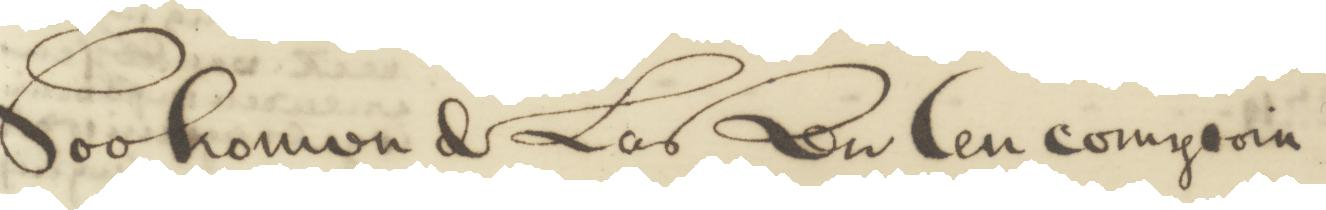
Sookomen deLasten ten comptoir
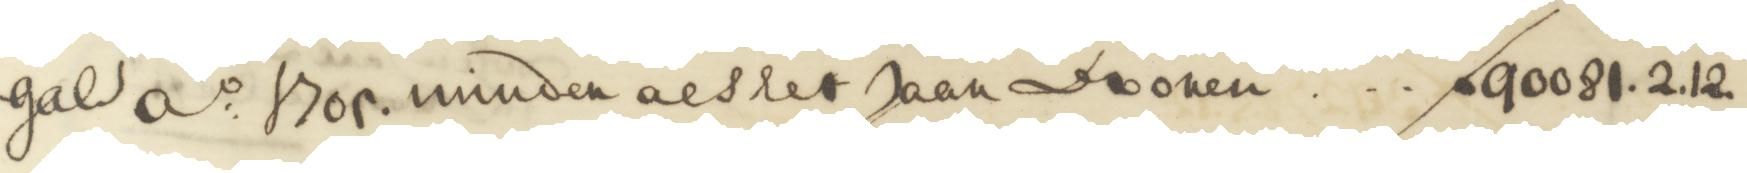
gale a:o 1705. minder als het Jaar tevoren - - - ƒ40081.2.12.
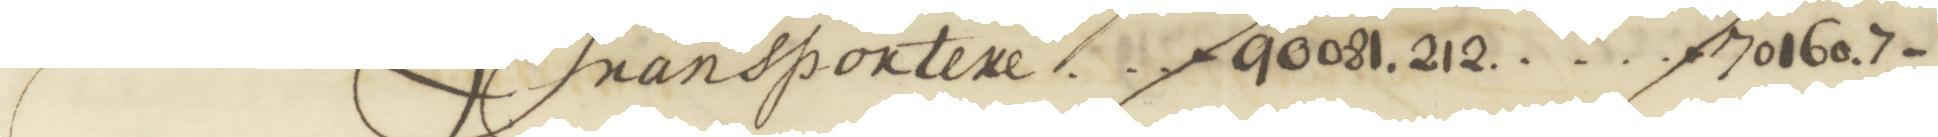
Transportere - - - ƒ40081.212 - - - - ƒ70160.7-
